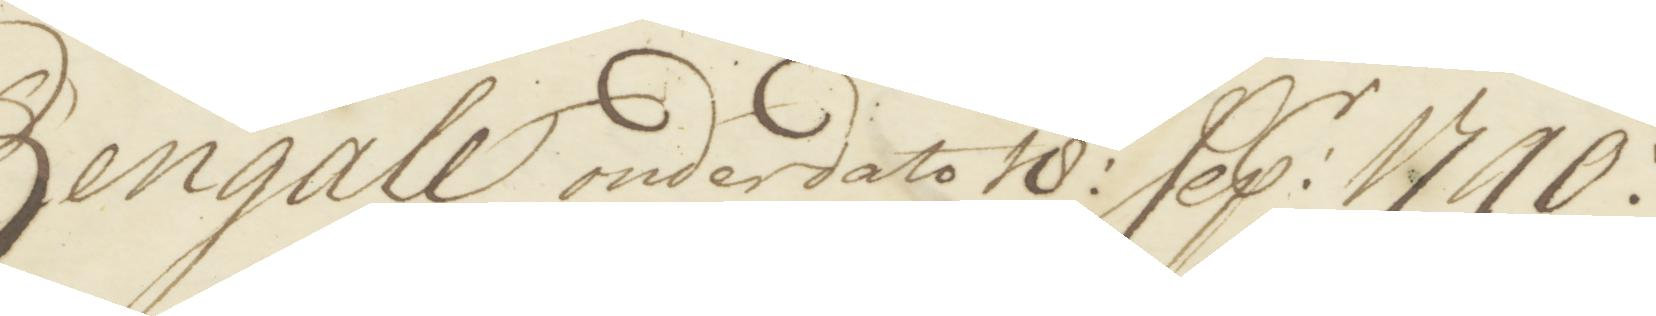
Van Bengale onder dato 18:' sep:r 1740:
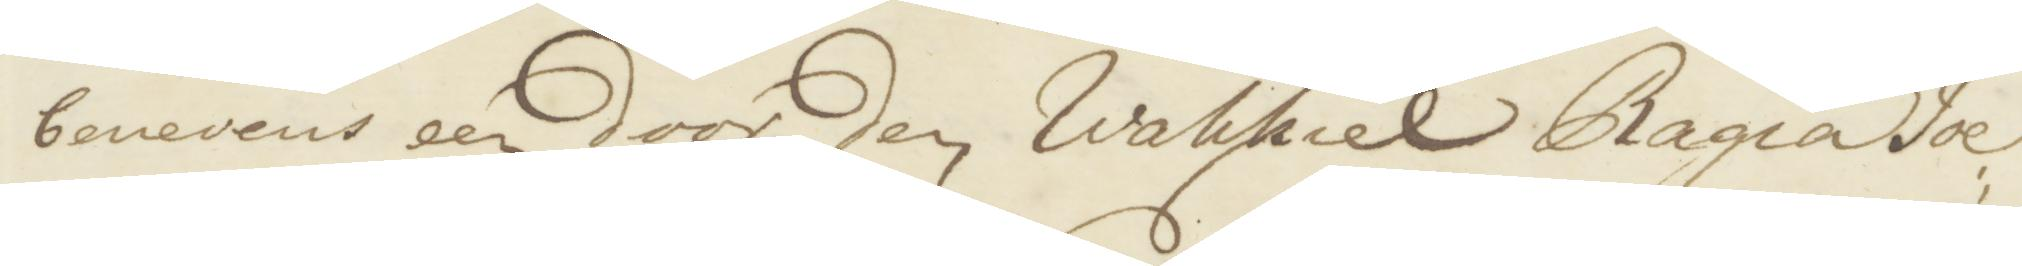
benevens een door den Wakkiel Ragia soe„
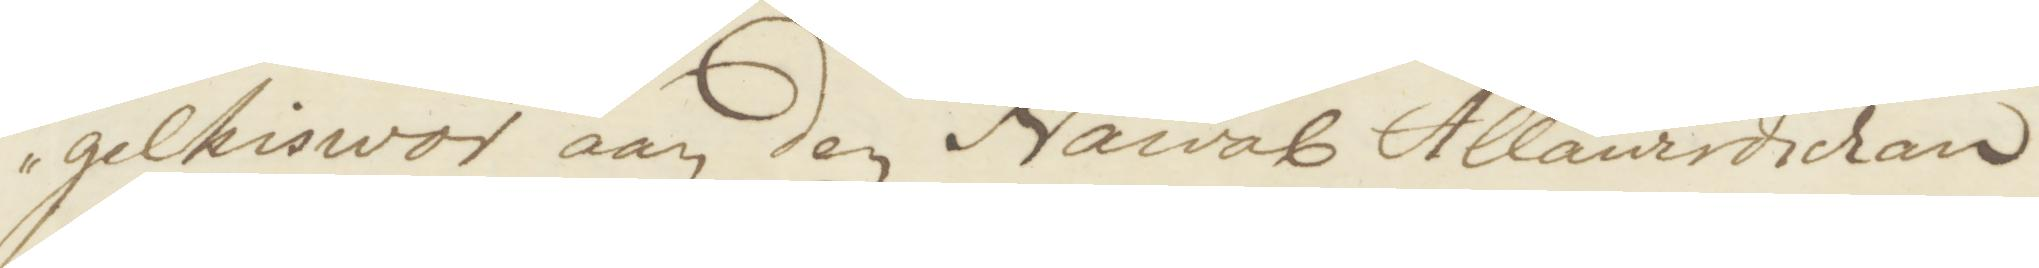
„gelkiswor aan den Nawab Allawirdichan
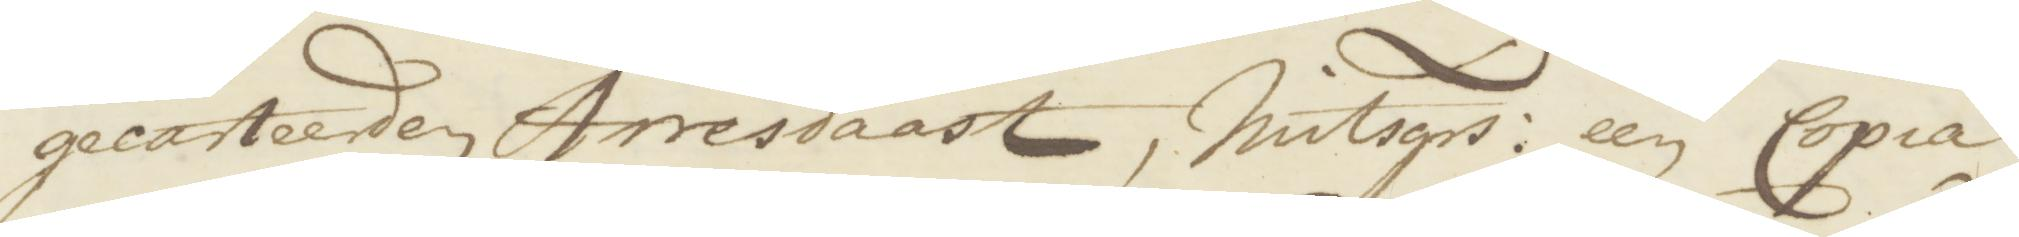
gecarteerden Arresdaast, mitsgrs: een Copia
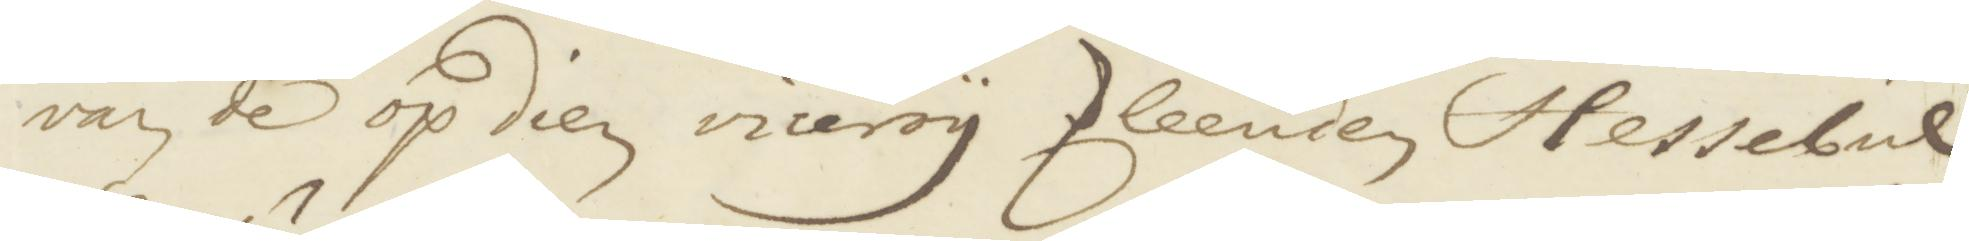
van de op dien viceroij verleenden Hessebul
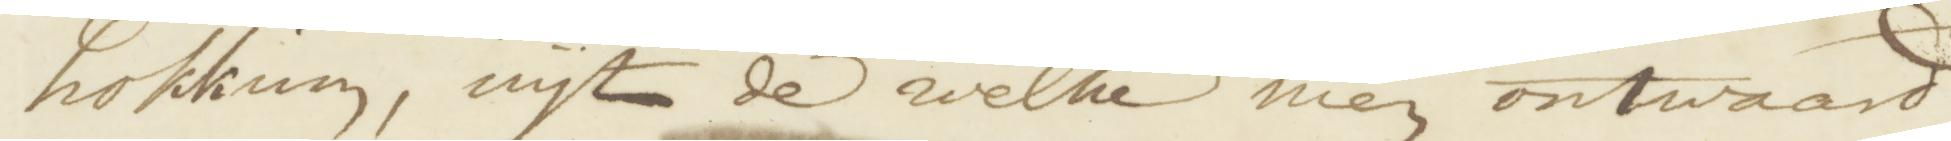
hokkum, uijt de welke men ontwaard
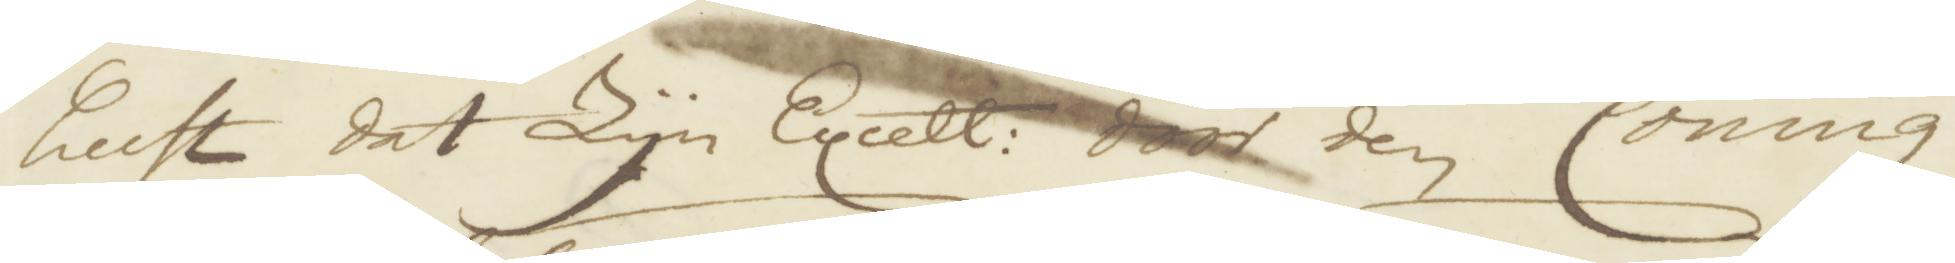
heeft dat zijn Exell: door den Coning
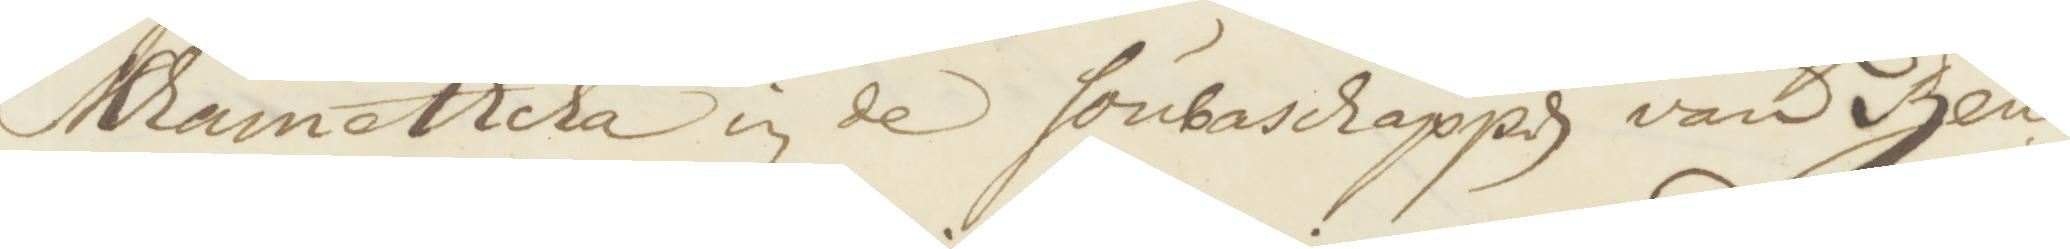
Mhamethcha in de soubaschappen van Ben
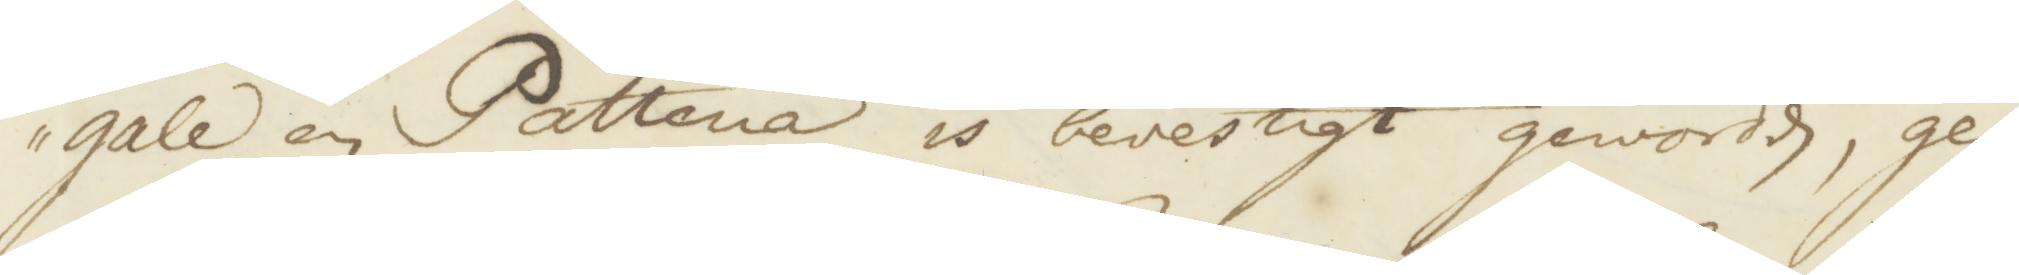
„gale en Pattena is bevestigt geworden, ge
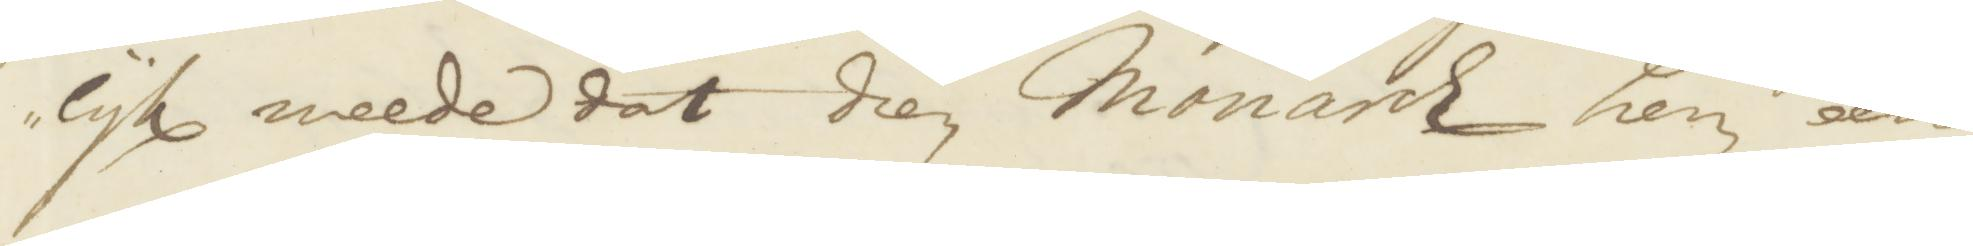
„lijk meede dat dien monarch hem een
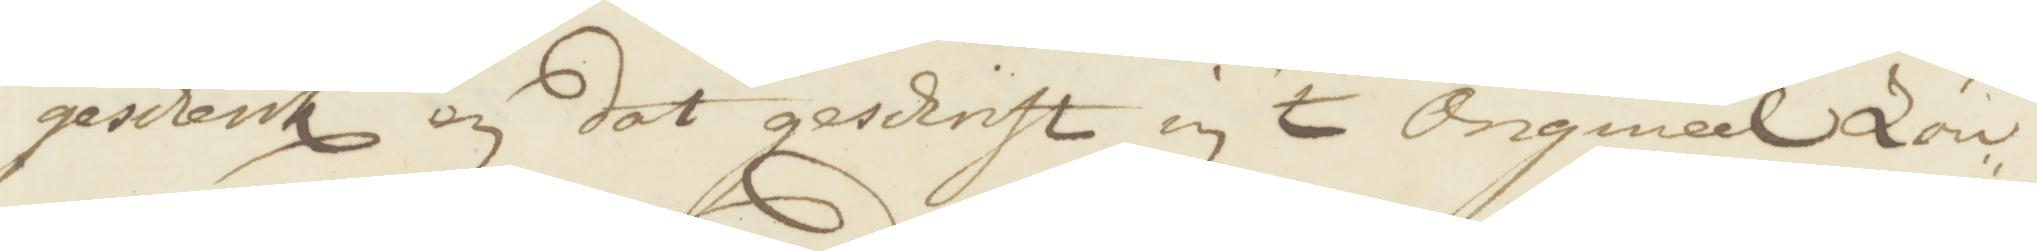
geschenk en dat geschift in ’t Origineel zou„
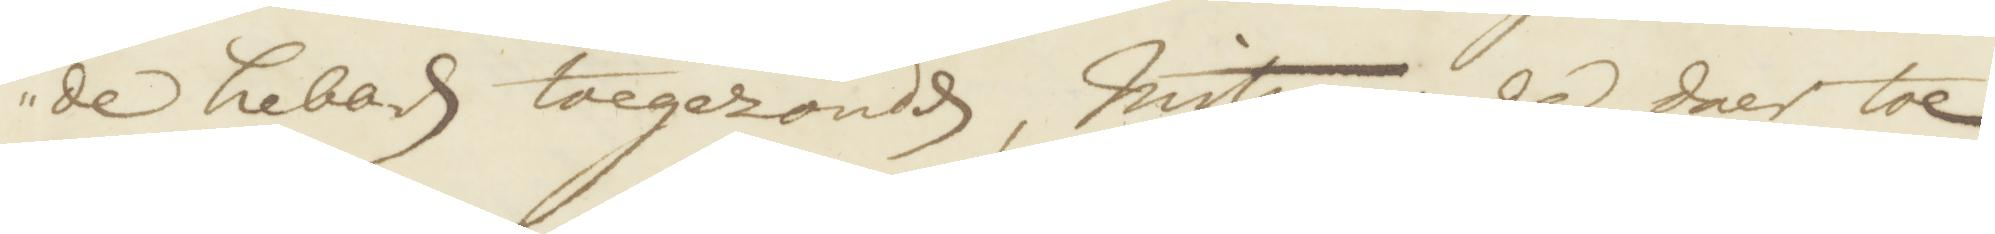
„de hebben toegezonden, mitsgrs: de daer toe
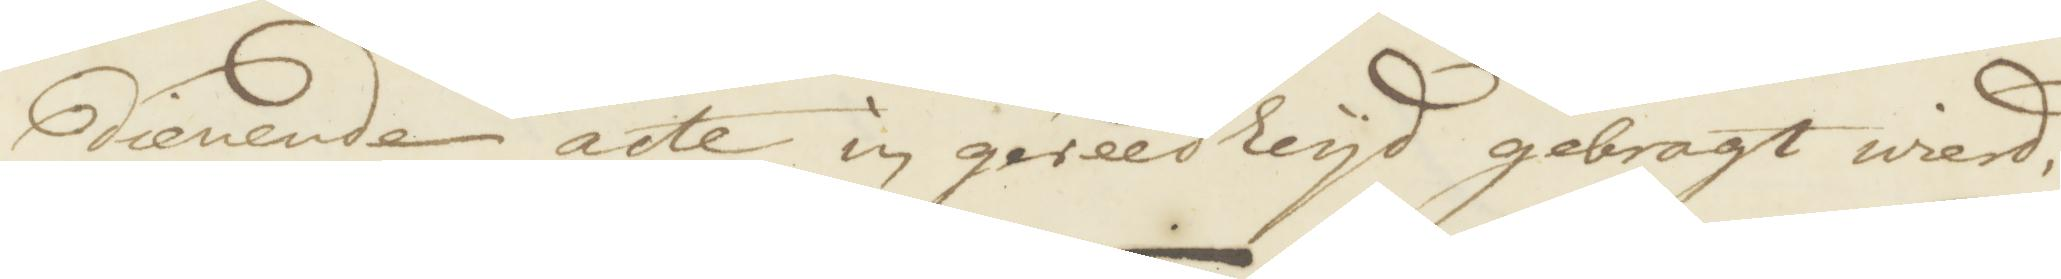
dienende acte in gereedheijd gebragt wierd,
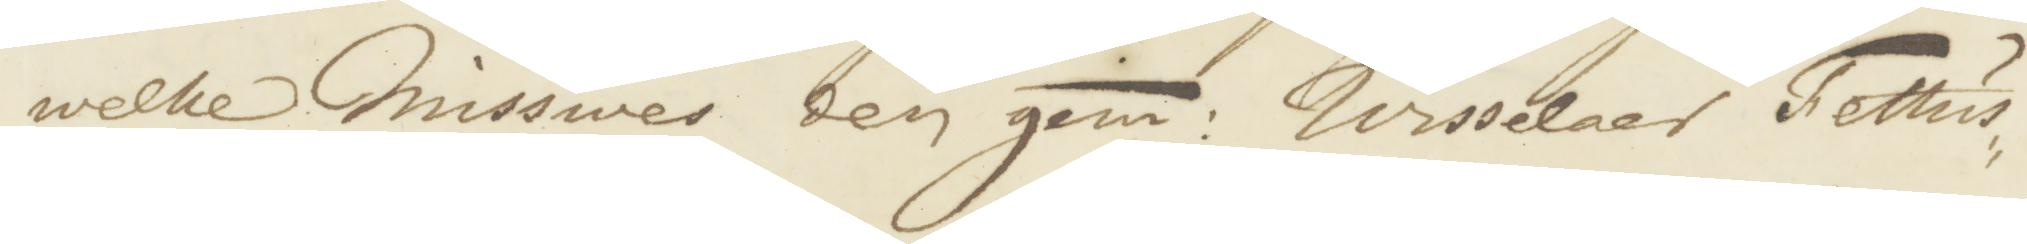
welke missives den gem: wisselaer Fettus„
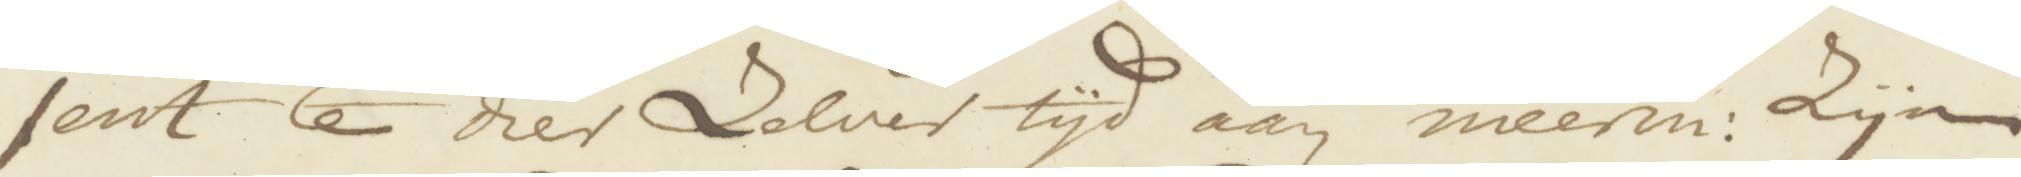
jent te dier zelver tijd aan meerm: zijn
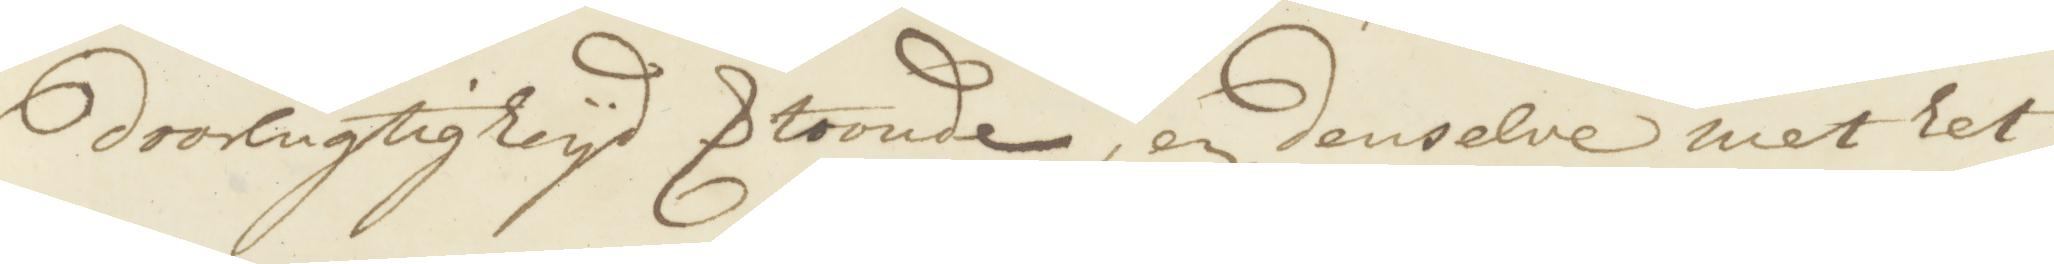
doorlugtigheijd vertoonde, en denselve met het
